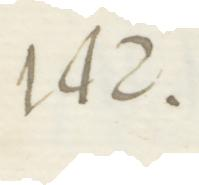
142.
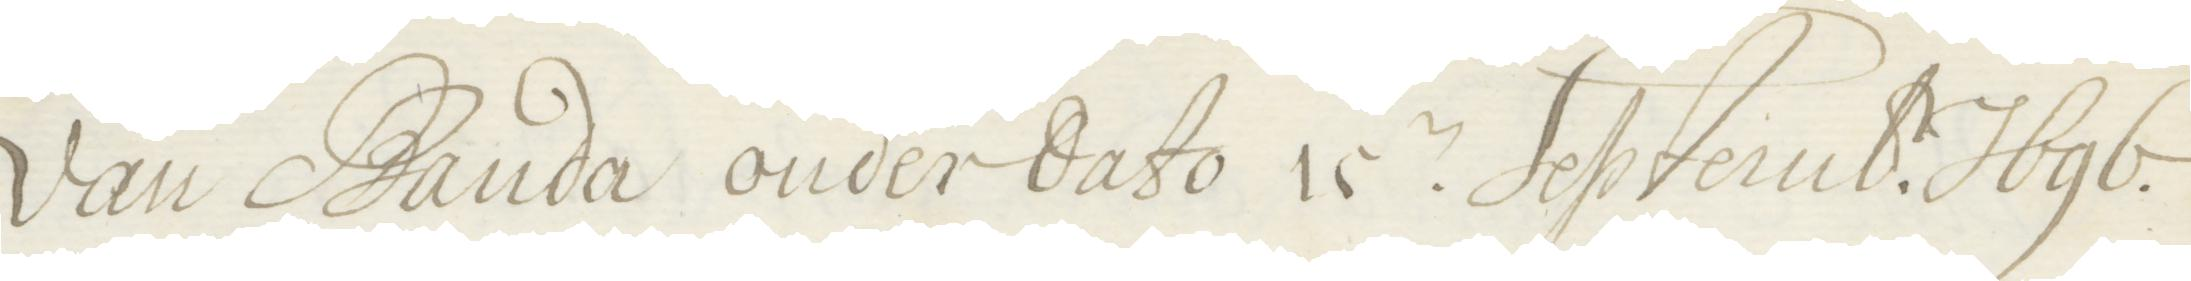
Van Banda onder dato 15.en Septemb:r 1696.
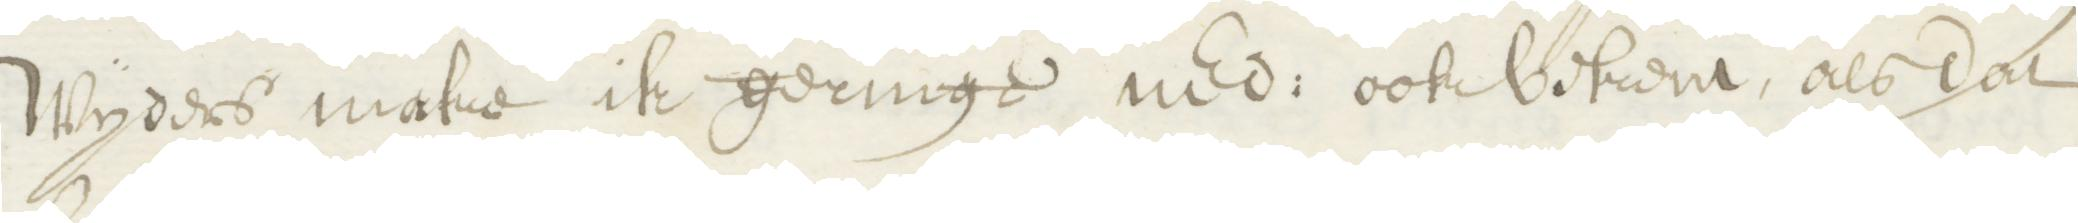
Wijders make ik geringe uEd: ook bekent, als dat
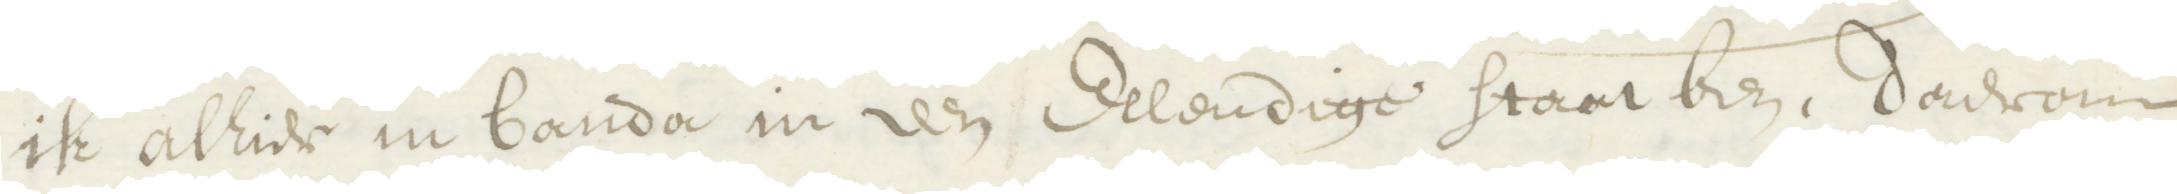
ik alhier in banda in een Ellendige staat ben, daerom
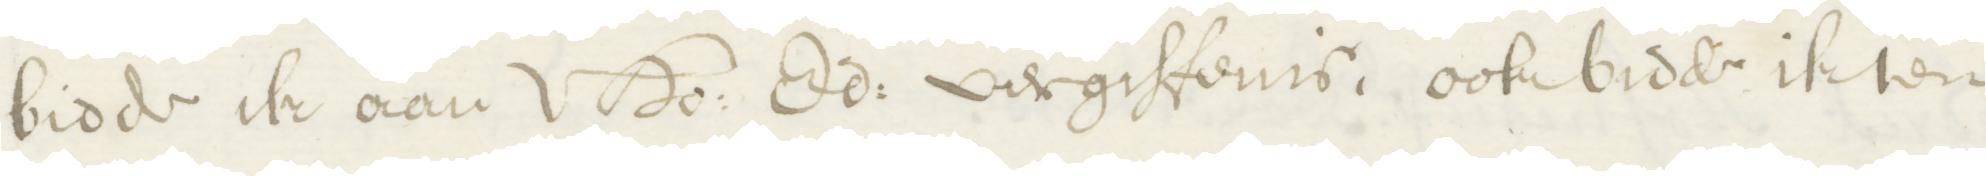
bidde ik aan VHo: Ed: vergiffenis, ook bidde ik ten
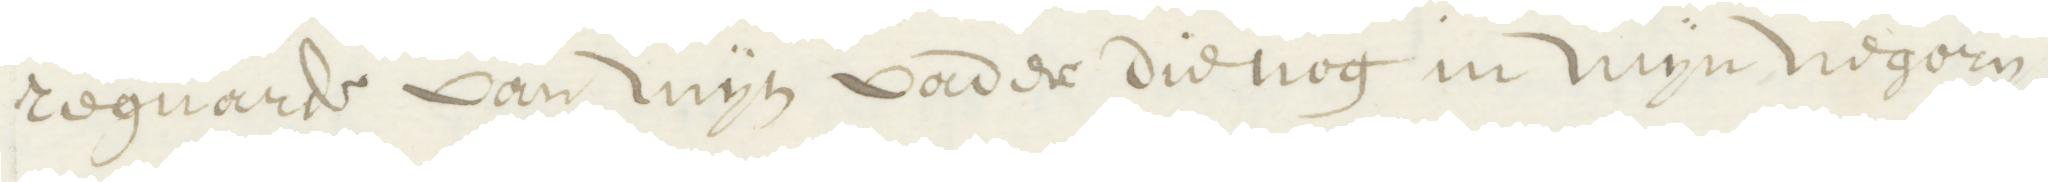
reguarde van Mijn vader die nog in Mijn Negorij
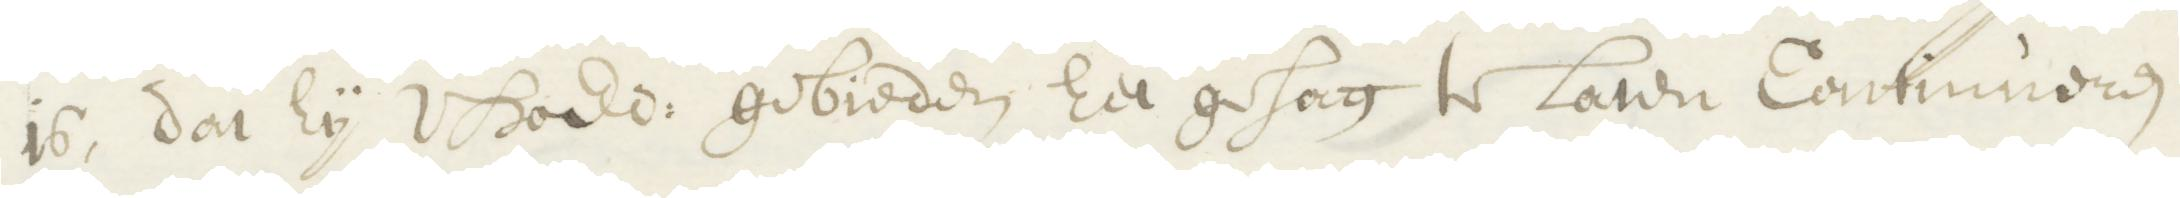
is, dat hij VHoEd: gebieden het gesag te laten Continueren
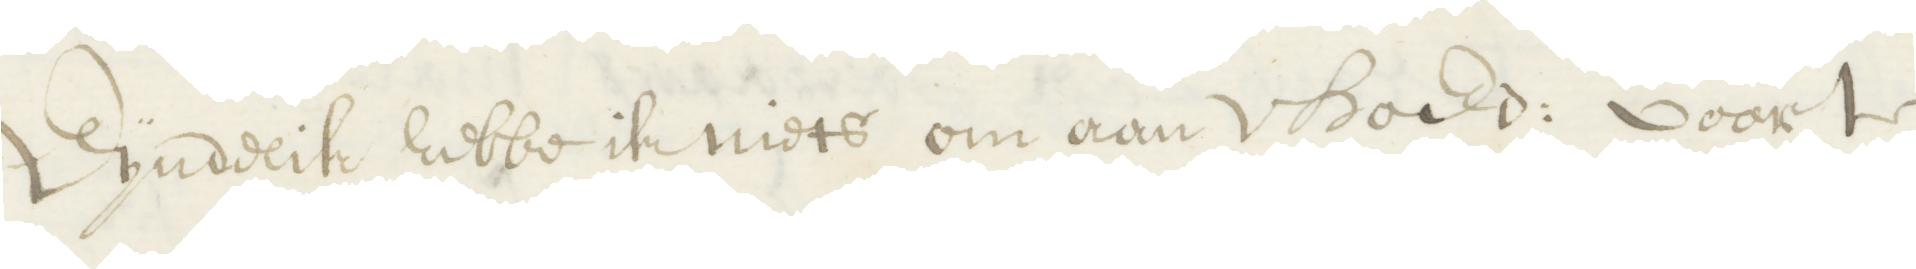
Eijndelik hebbe ik niets om aan VHoEd: voor te
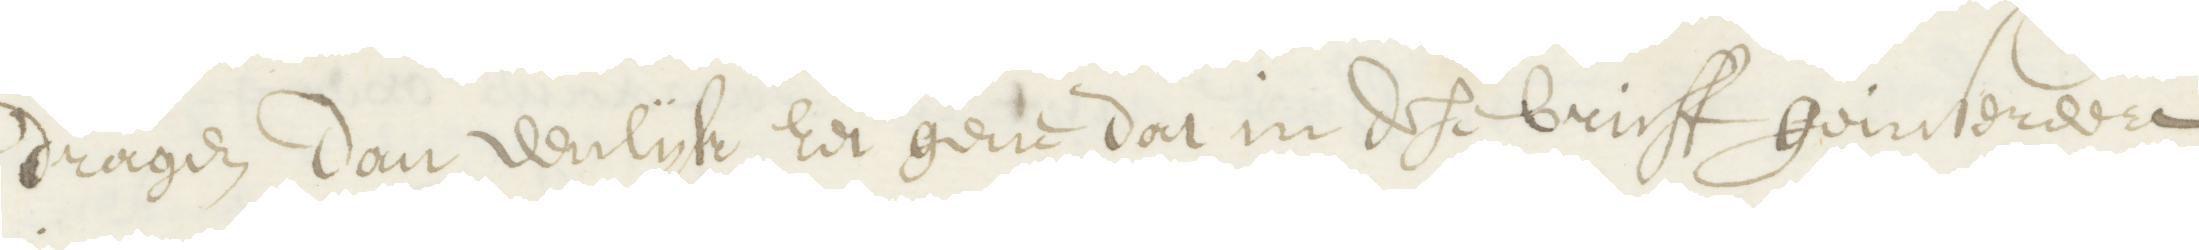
dragen dan eenlijk het gene dat in dese brieff geinsereert
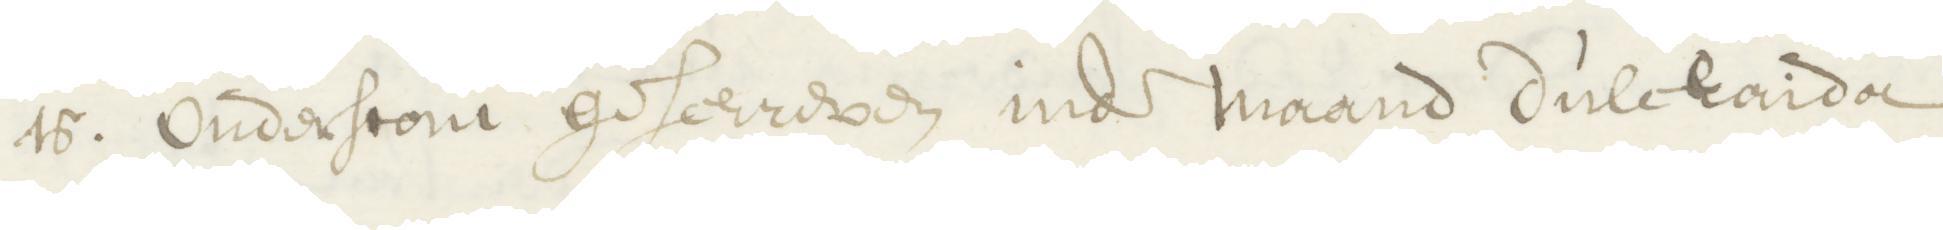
is. Onderstont geschreven inde Maand dulchaida
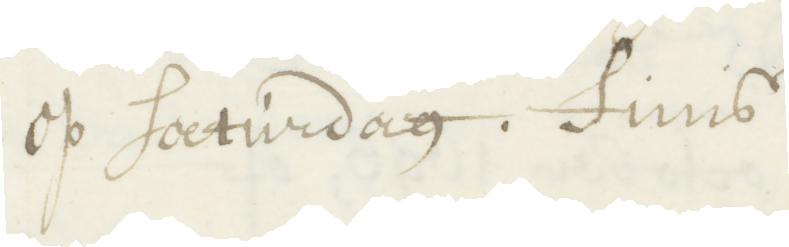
op Saturdag. finis
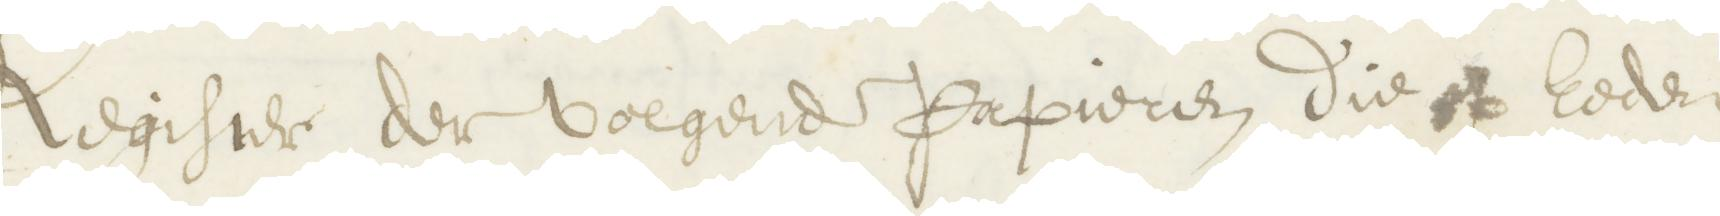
Register der volgende papieren die op heden
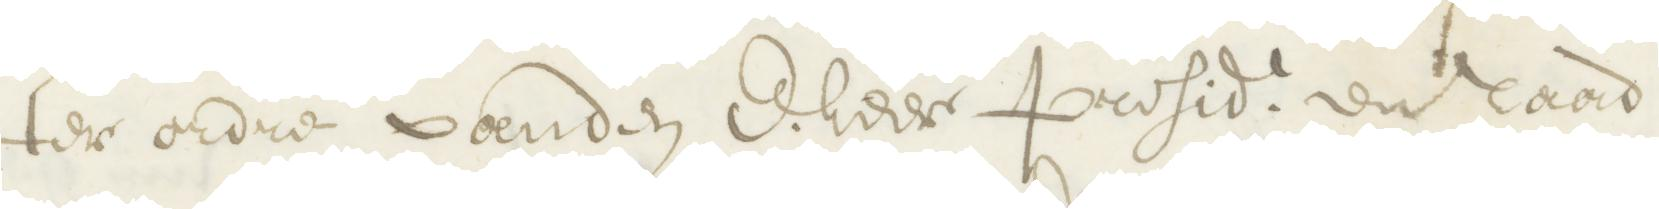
ter ordre van den E. heer Presid.t en Raad
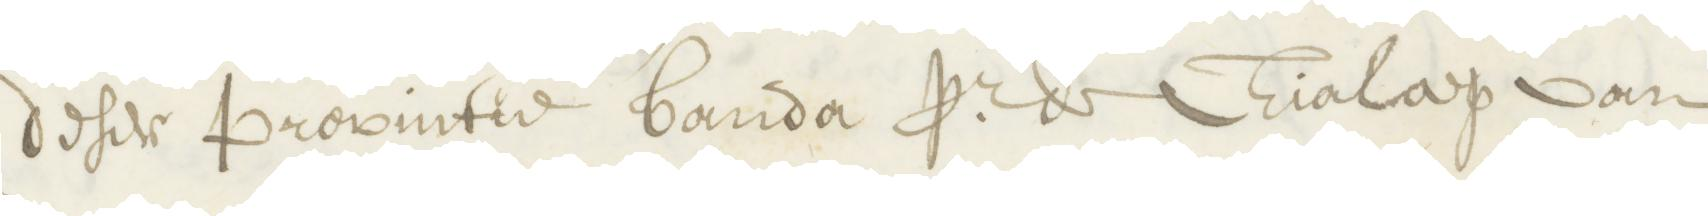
deser provintie banda p.r de Chialoep van
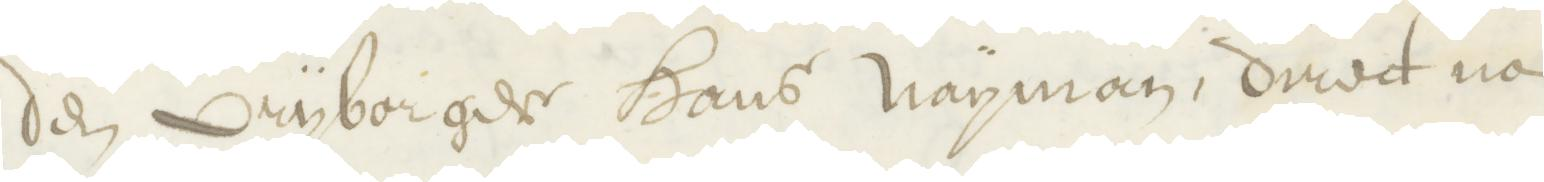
den vrijborger Hans Naijman, direct na
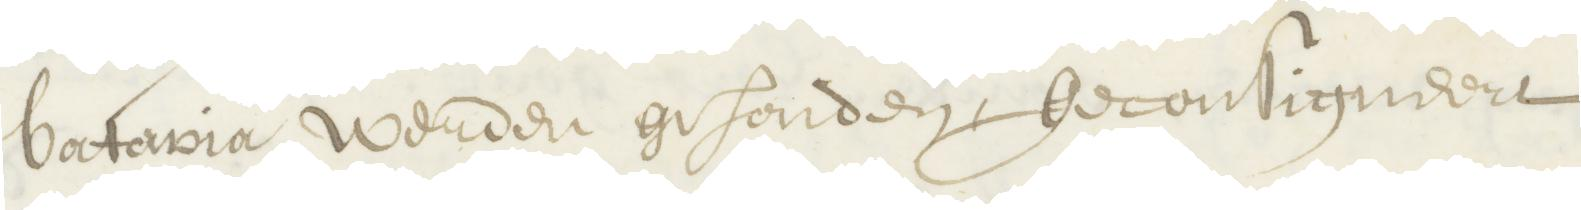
batavia werden gesonden, geconsigneert
